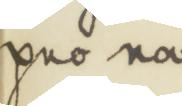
pro ra
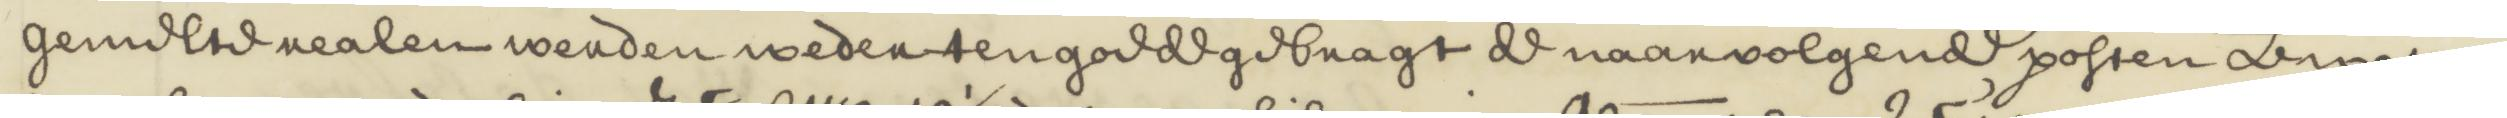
gemelte realen werden weder ten goede gebragt de naarvolgende posten te weten
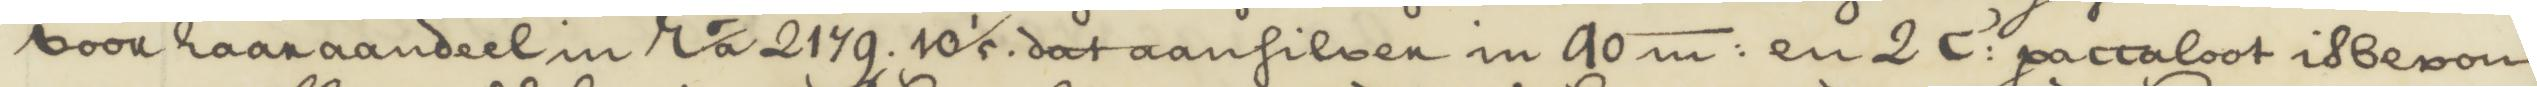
voor haar aandeel in ro/a 2179. 10 1/5. dat aansilver in 40 m: en 2c:' paccaloot is bevon
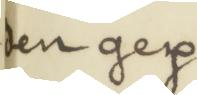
den gep
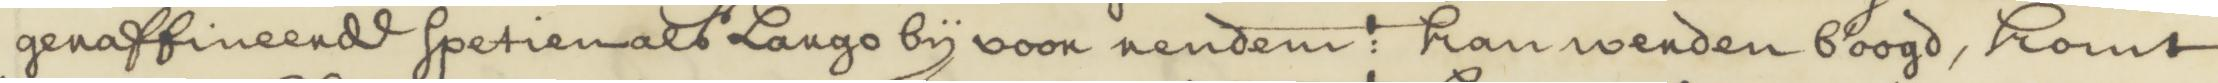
geraffineerde spetien als Largo bij voor rendem:t kan werden b'oogd, komt
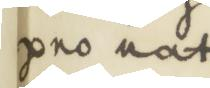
pro rat
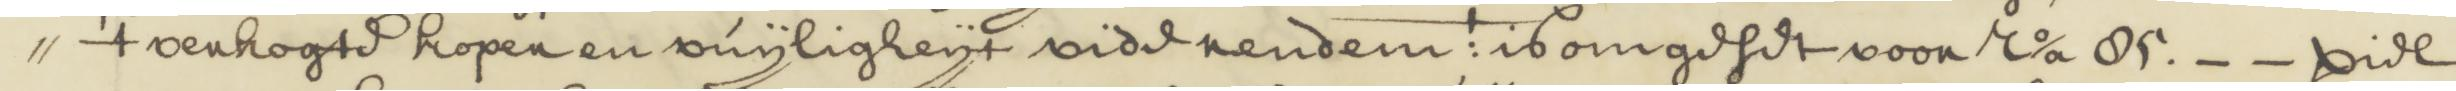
„ ’t verkogte koper en vuijligheijt vide rendem:t is omgeset voor ro/a 85. – – piel
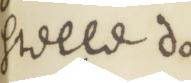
stelle do
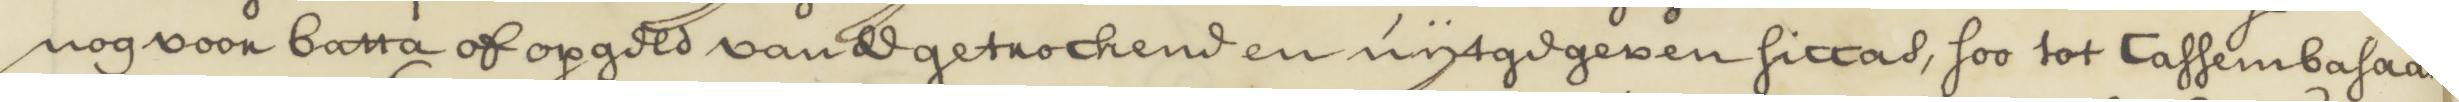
nog voor batta of opgeld van de getrockene en uijtgegeven siccas, soo tot Cassembasaar
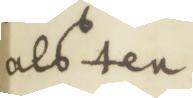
als ter
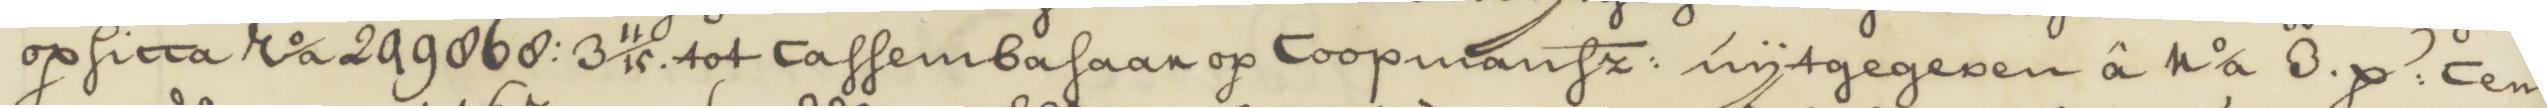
op sicca ro/a 249868: 3 11/15. tot Cassembasaar op Coopmansz: uijtgegeven â ro/a 3. p:' cento
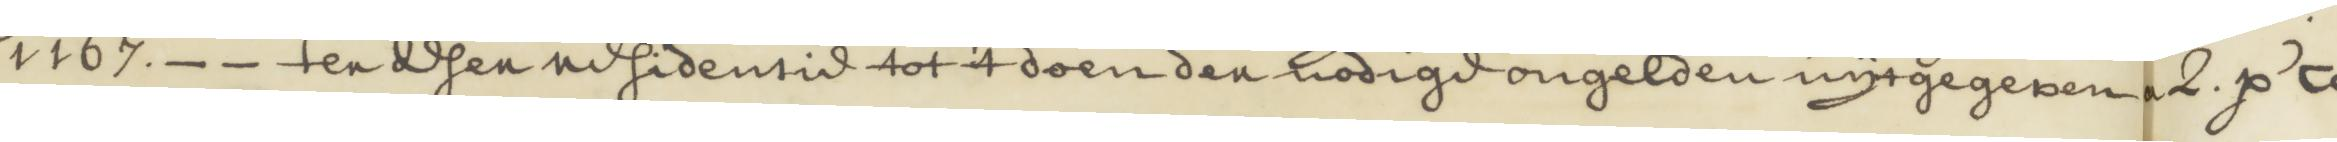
_=o „ 1167. – – ter deser residentie tot ’t doen der nodige ongelden uijtgegeven 2. p' c
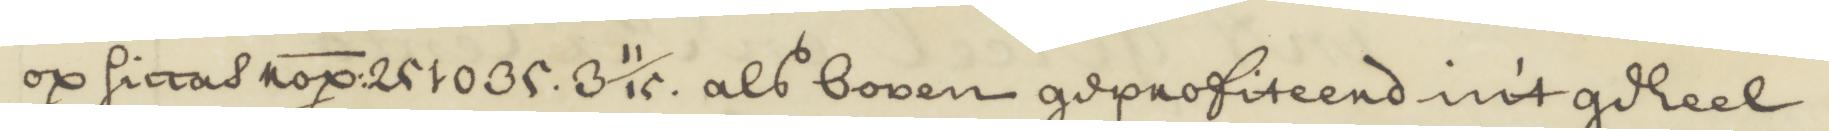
op siccas rop: 251035. 3 11/15. als boven geprofiteerd in’t geheel
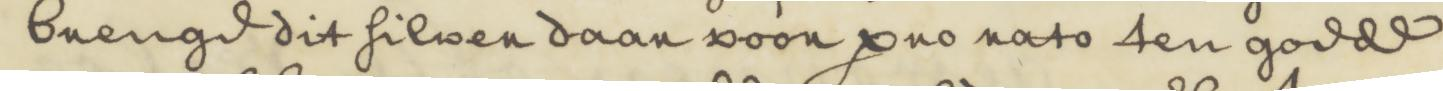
brenge dit silver daar voor pro rato ten goede
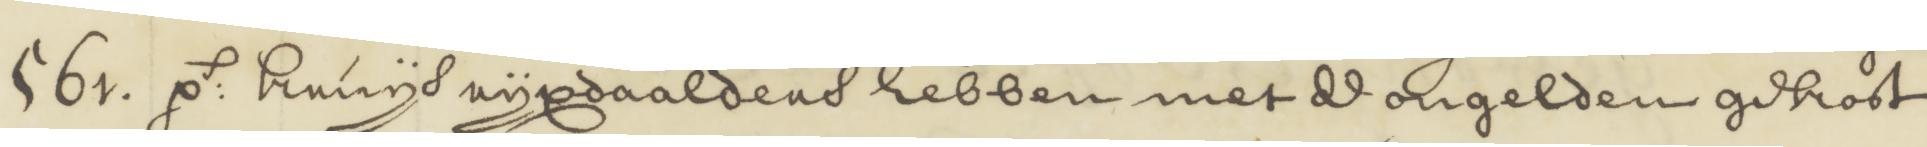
561. p:s kruijs rijxdaalders hebben met de ongelden gekost
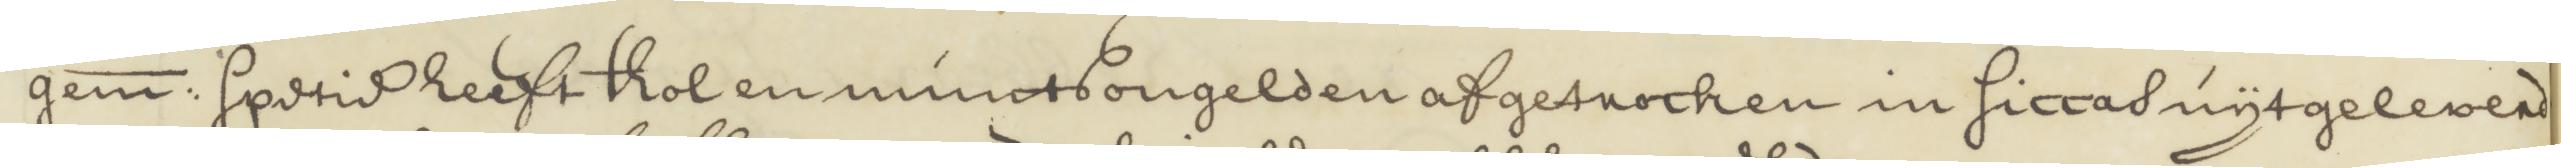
gem: spetie heeft thol en muntsongelden afgetrocken in siccas uijtgeleverd
